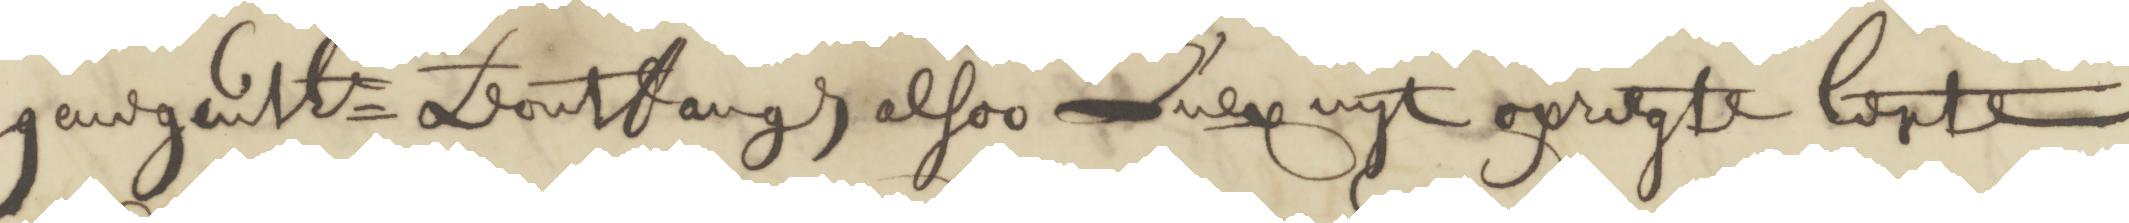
genegenth=t te ontfangen alsoo Zulx uijt op regte herte
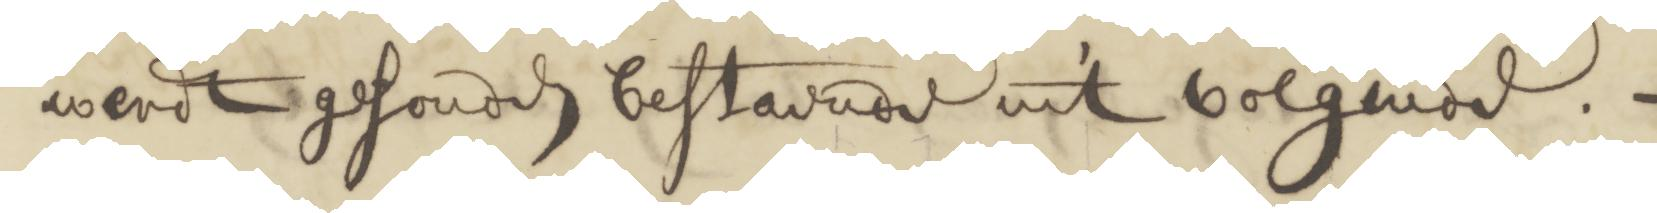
werdt gesonden bestaende in't volgende.
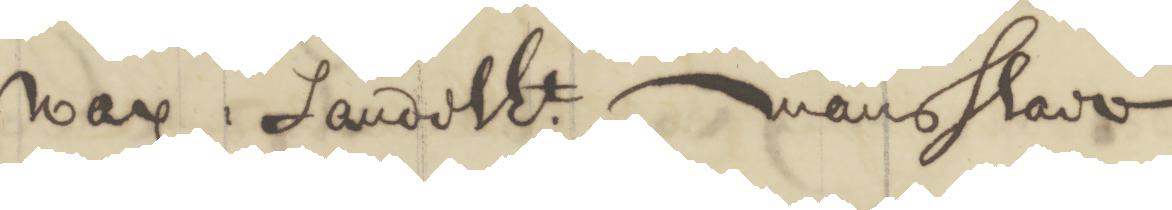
wax : sandelh:t mansslaev
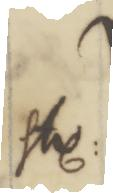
stx
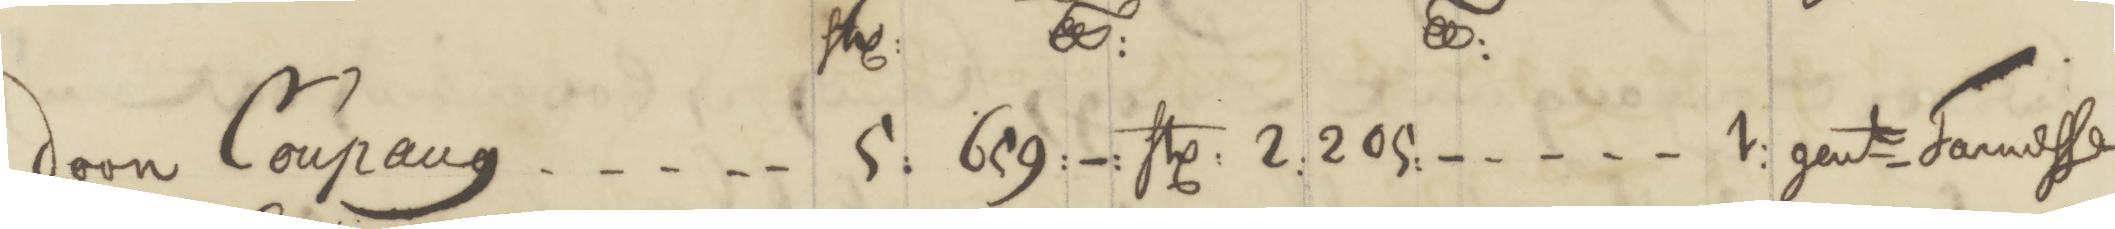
door Coupang - - - - - 5: 659: - : stx: 2: 205: - - - - - 1: gen=t Tarnesse
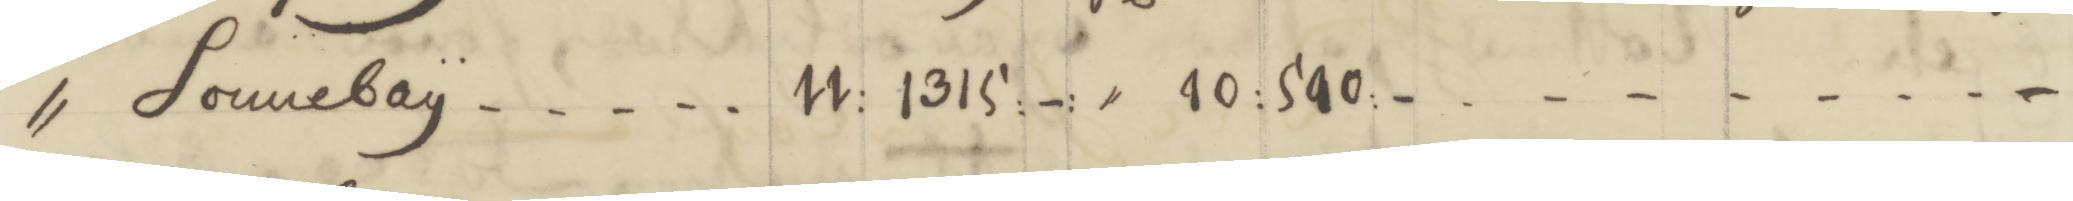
„ Sonnebaij - - - - - 11: 1315: - : „ 40: 540: - - - - - - - - -
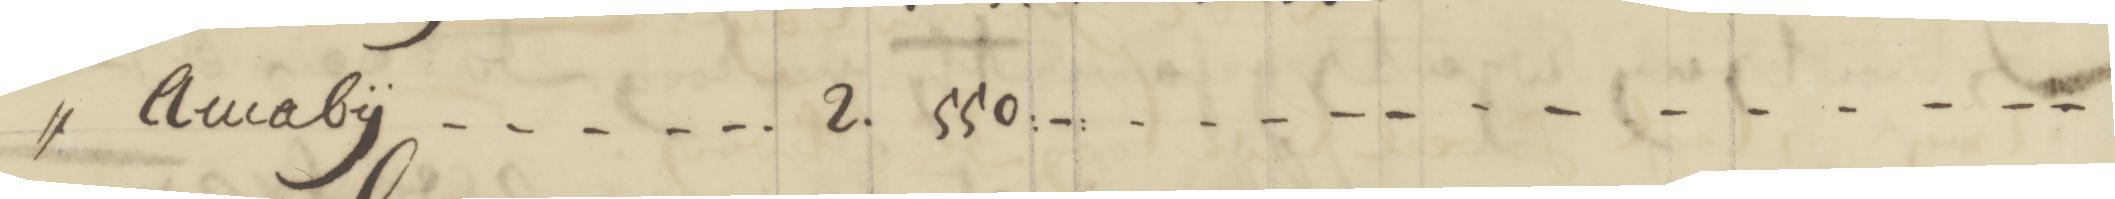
„ Amabij - - - - - - 2. 550: - : - - - - - - - - - - - - -
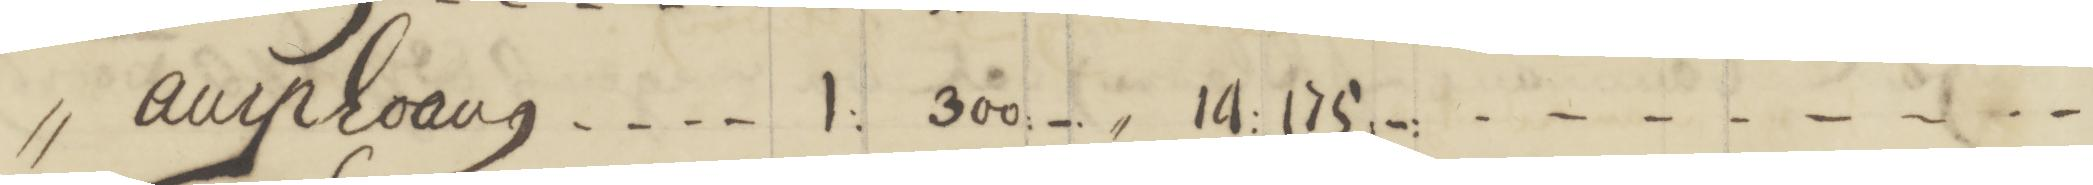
„ amphoang - - - - 1: 300: - . „ 14: 175 : - : - - - - - - - -
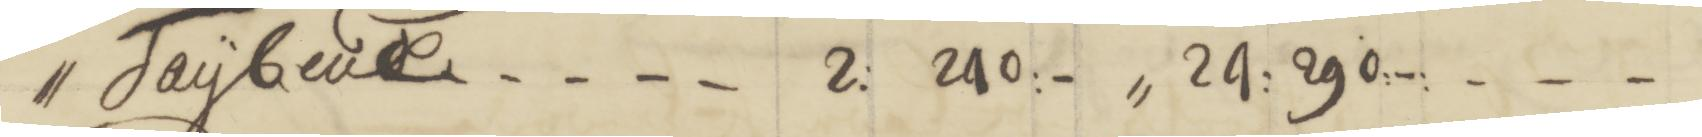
„ Taijbeul - - - - 2: 240: - „ 24: 290:-: - - -
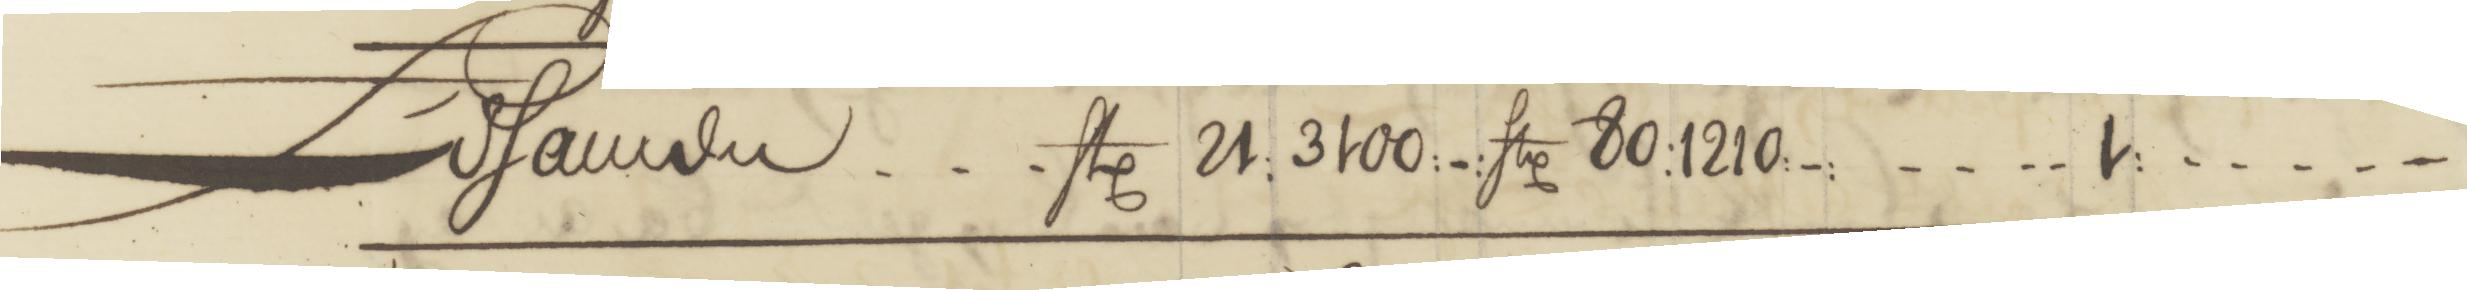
tesamen - - - stx 21: 3100:-: stx 80:1210:-: - - - - 1: - - - - -
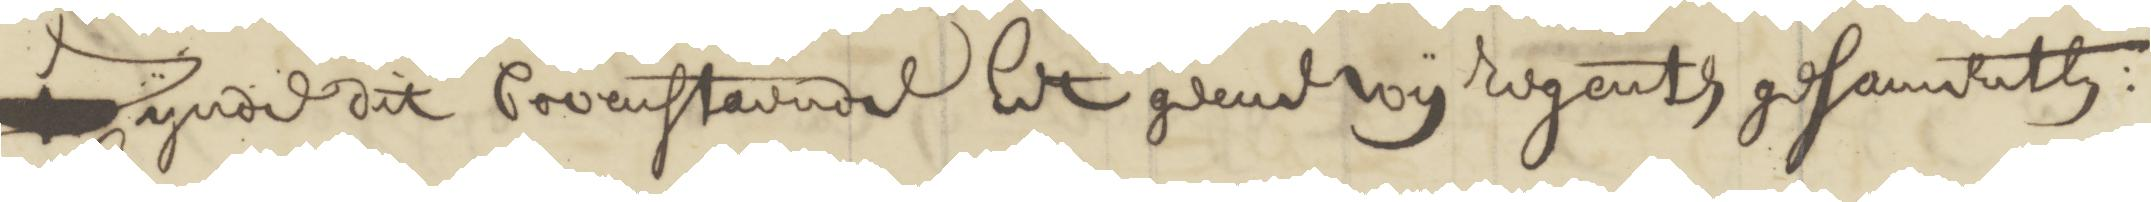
Zijn de dit bovenstaende het geene wij regenten gesamentlijk
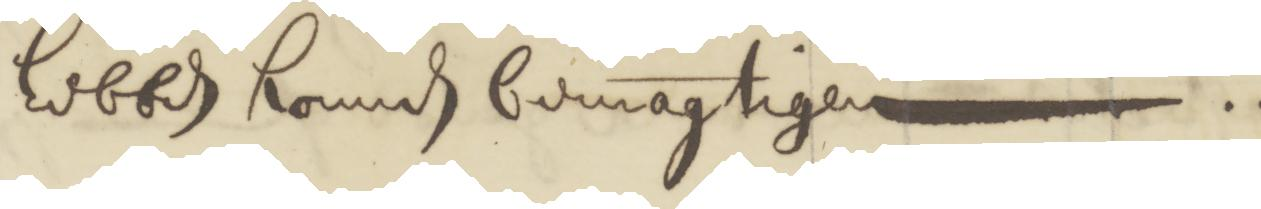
hebben konnen bemagtigen
